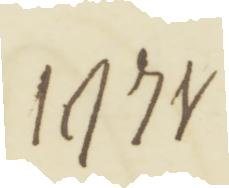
1471
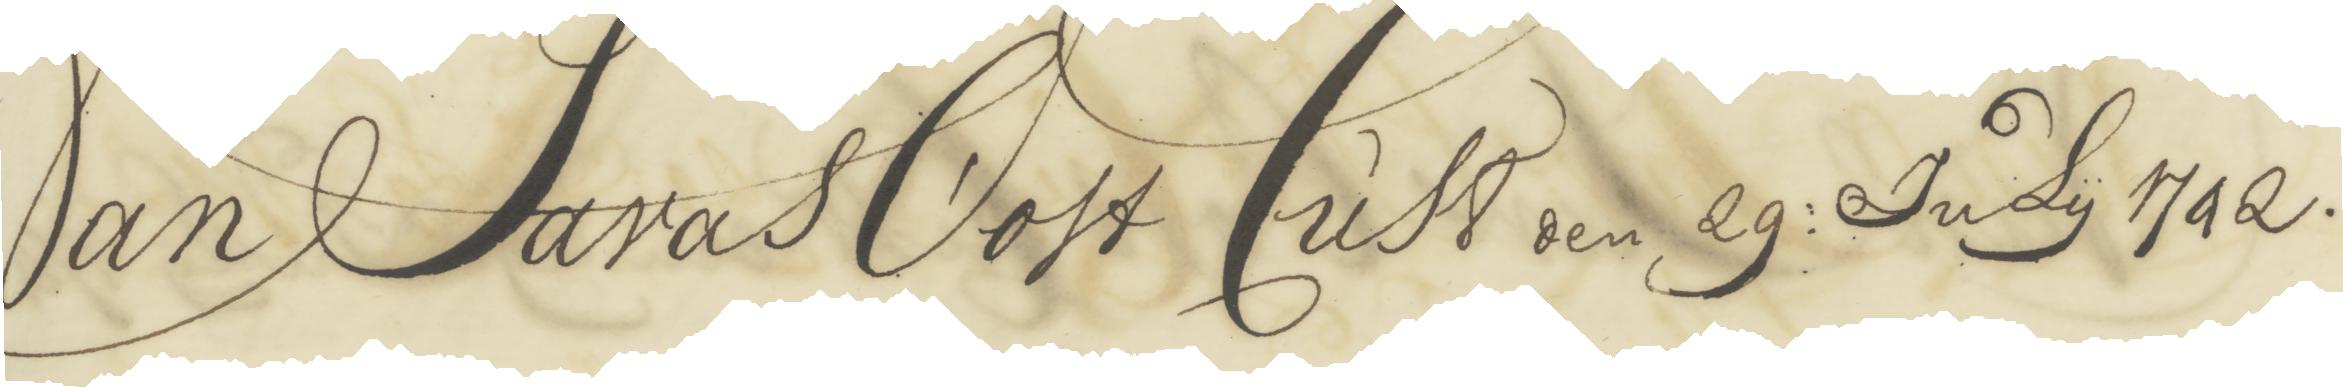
Van Iavas Oost Cust den 29: Iulij 1742.
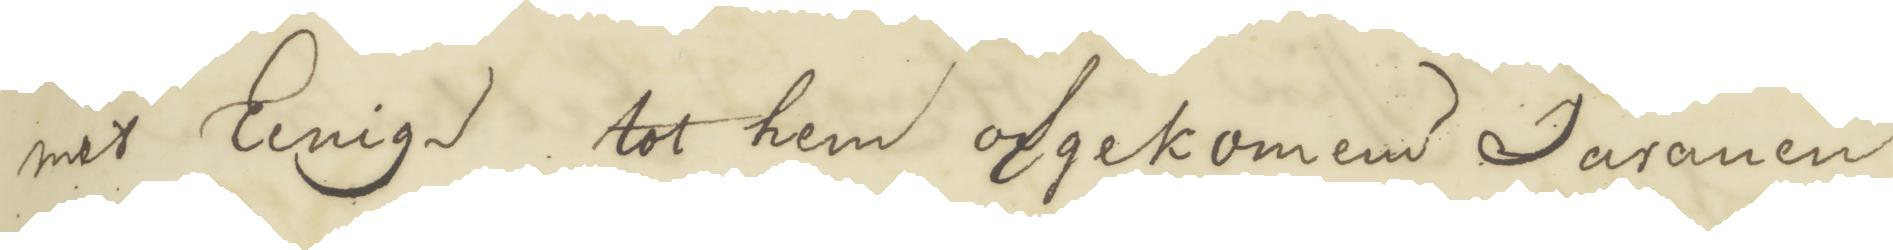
met Eenige tot hem overgekomene Iavanen
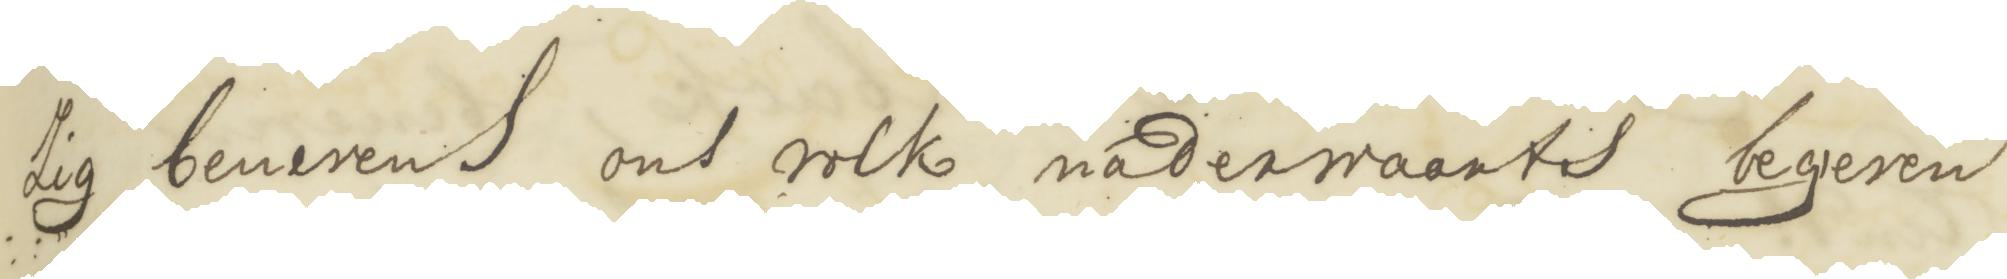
zig benevens ons volk naderwaarts begeven
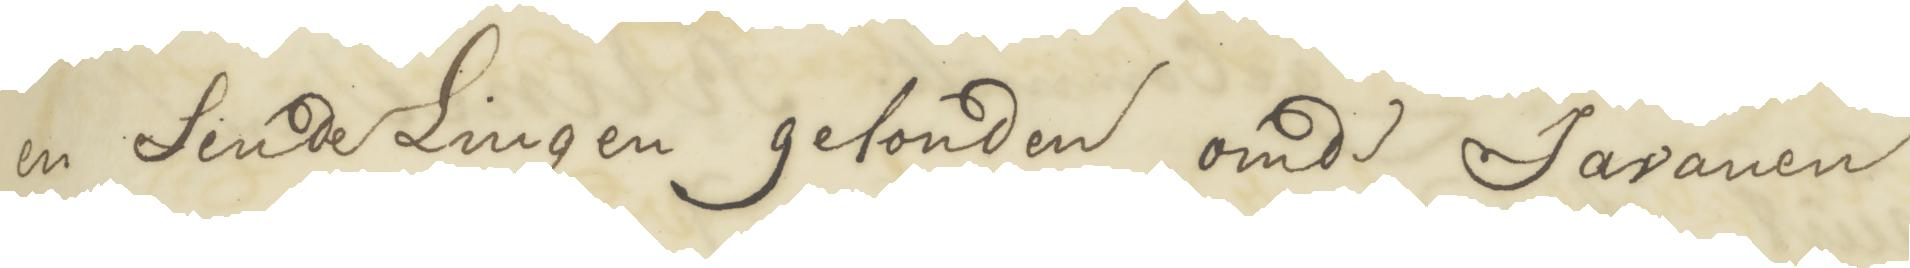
en sendelingen gesonden omde Iavanen
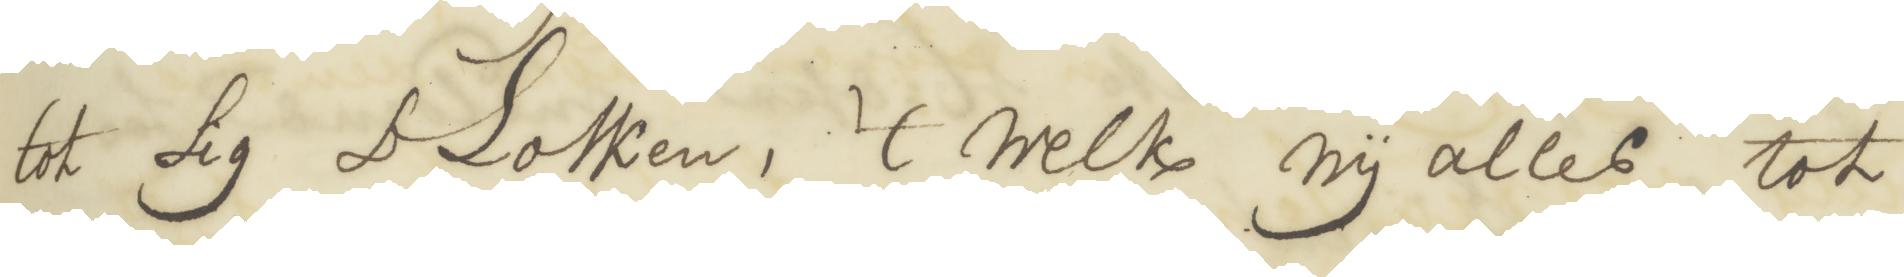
tot sig te lokken, ’t welk wij alles tot
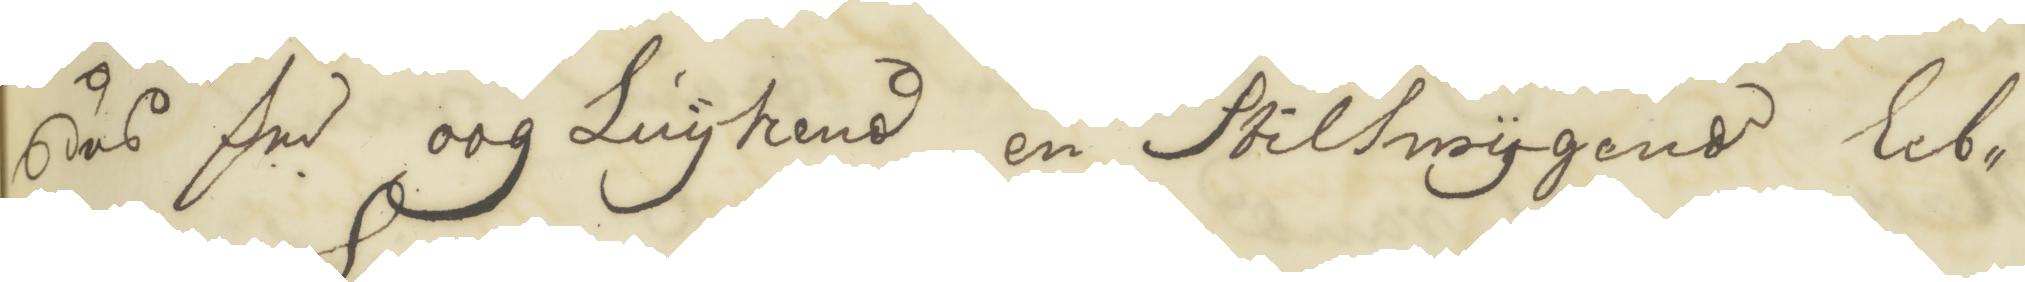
dus verre oog luijkend en stilswijgende heb„
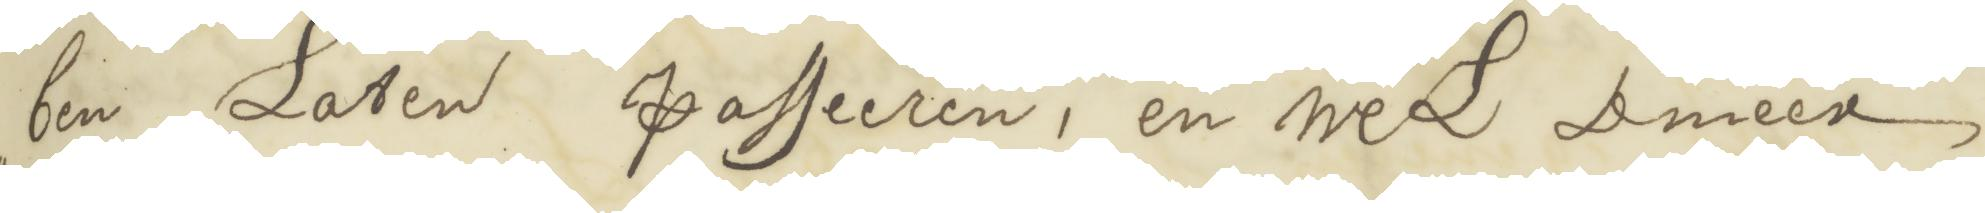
ben laten passeeren, en wel temeer
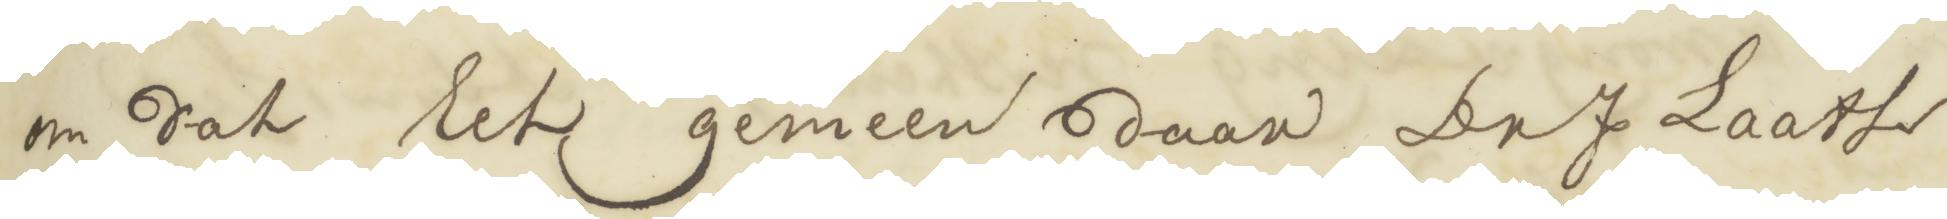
om dat het gemeen daar terplaatse
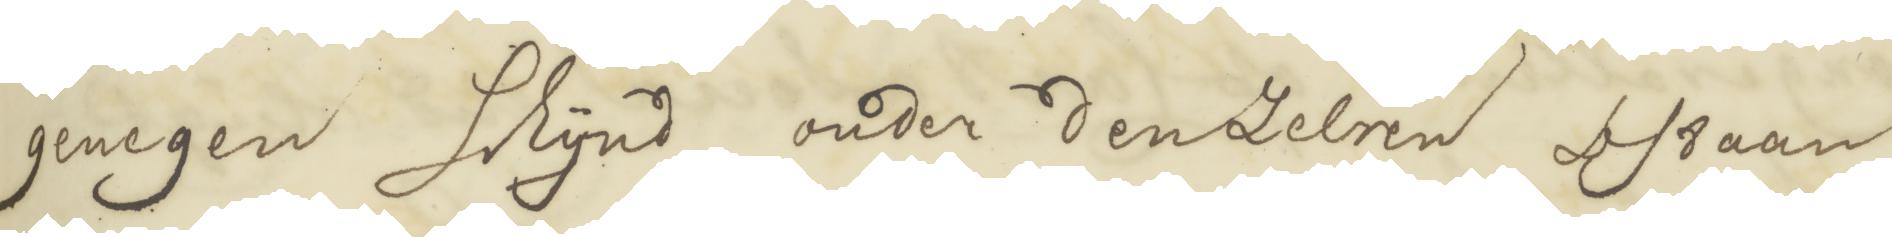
genegen schijnd onder denzelven testaan
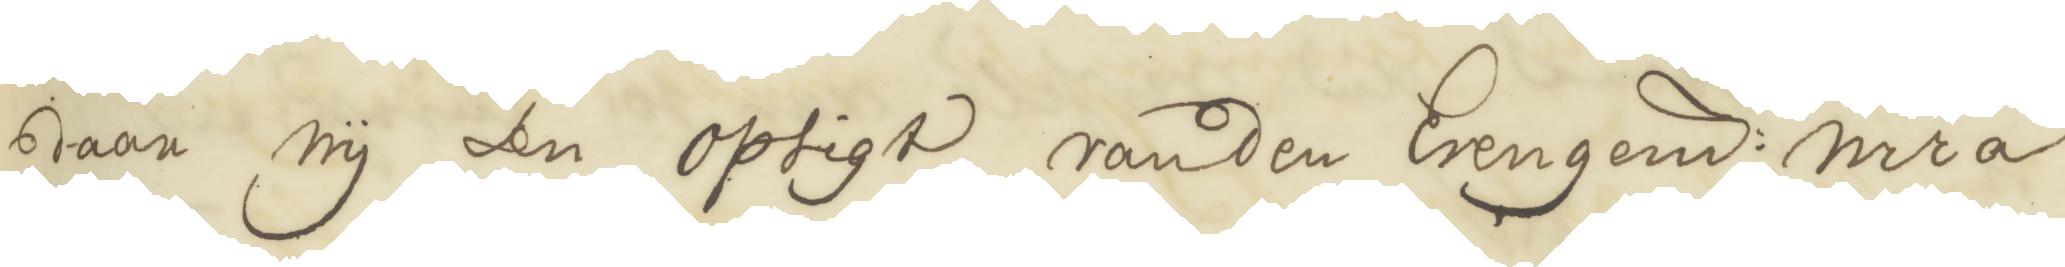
daar wij ten opsigt van den Evengem: wira
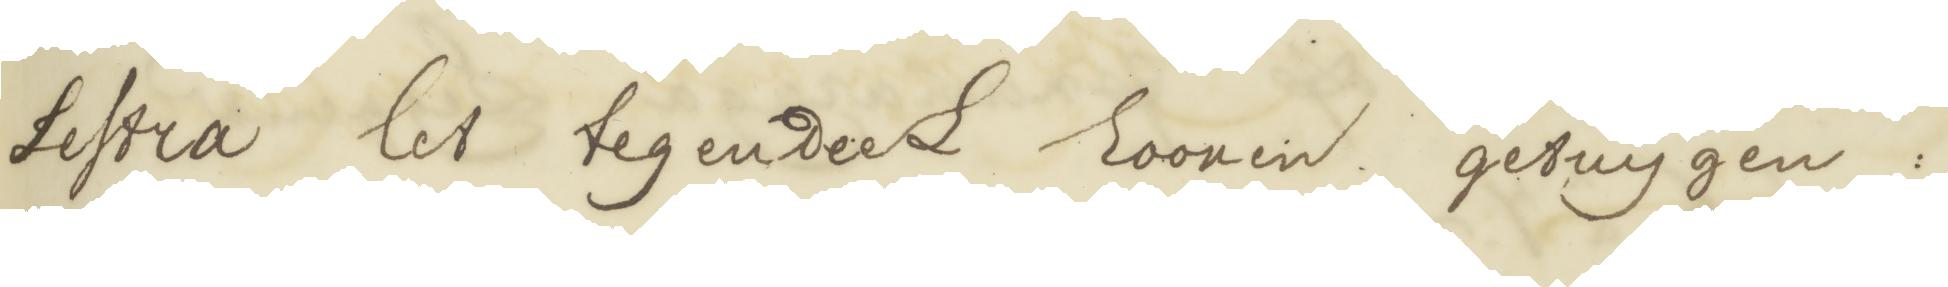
sestra het tegendeel hooren getuijgen:
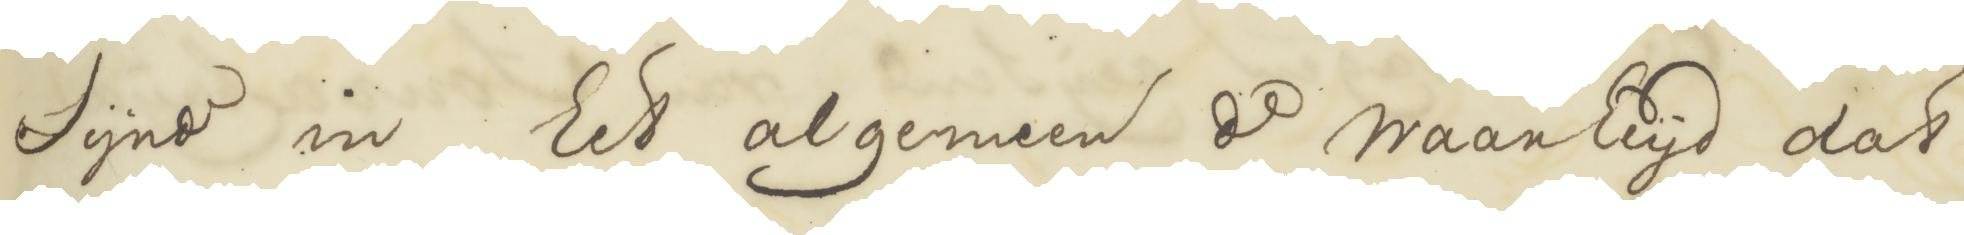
sijnde in het algemeen de waarheijd dat
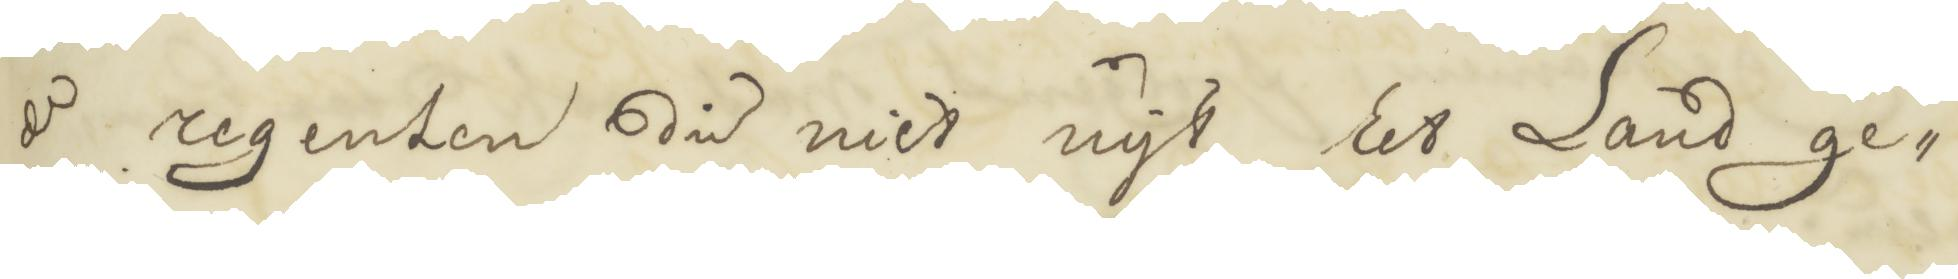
de regenten die niet uijt het land ge„
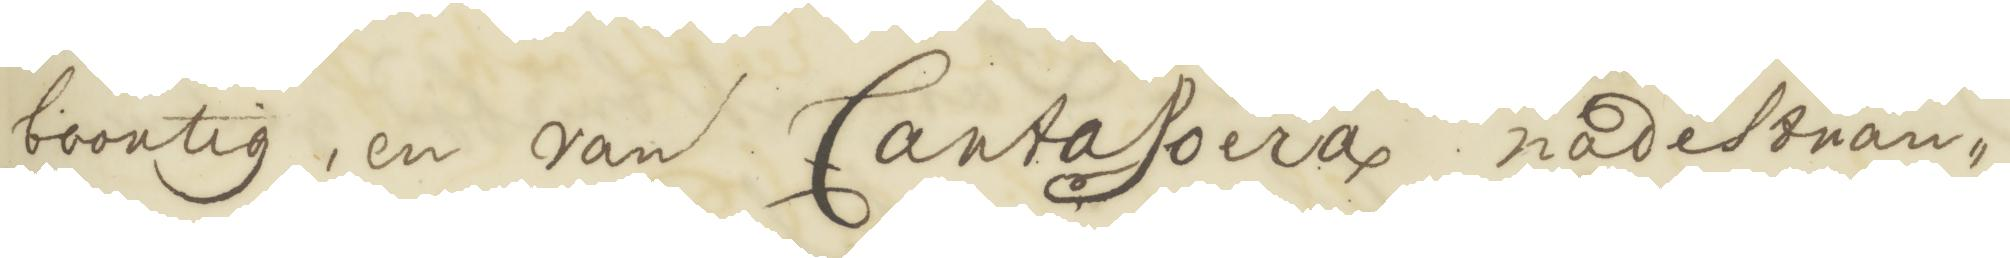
boortig, en van Cartasoera nadestran„
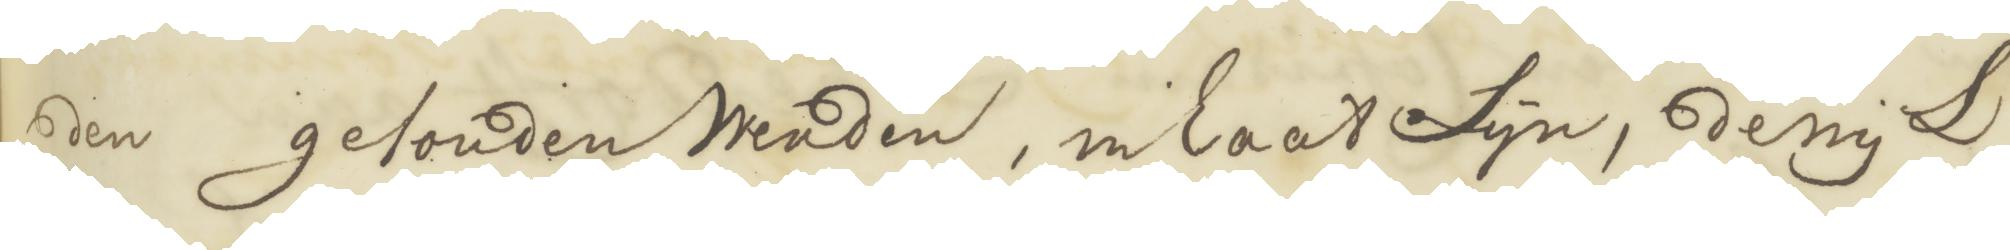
den gesonden werden, in haat sijn, dewijl
